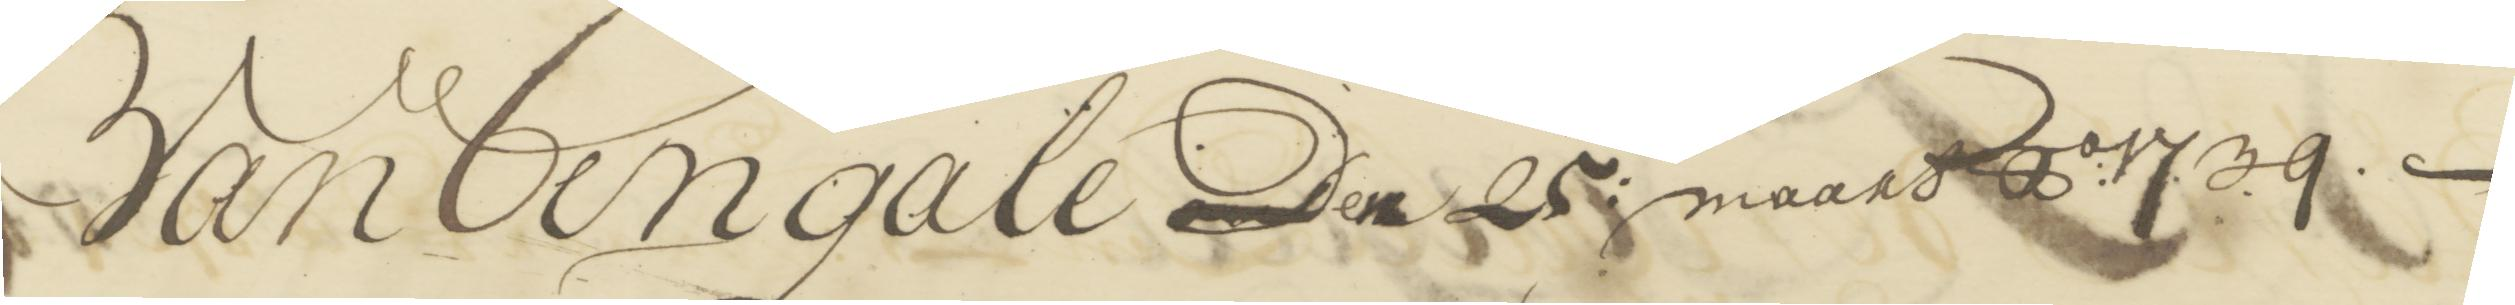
Van Bengale Den 25:' maart a:o 1739.
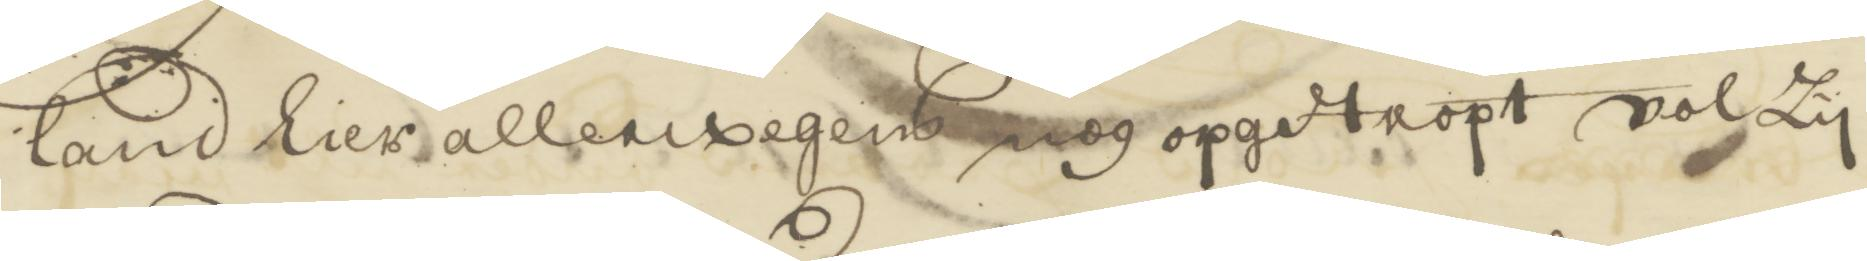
land hier allerwegens nog opgetropt vol zij
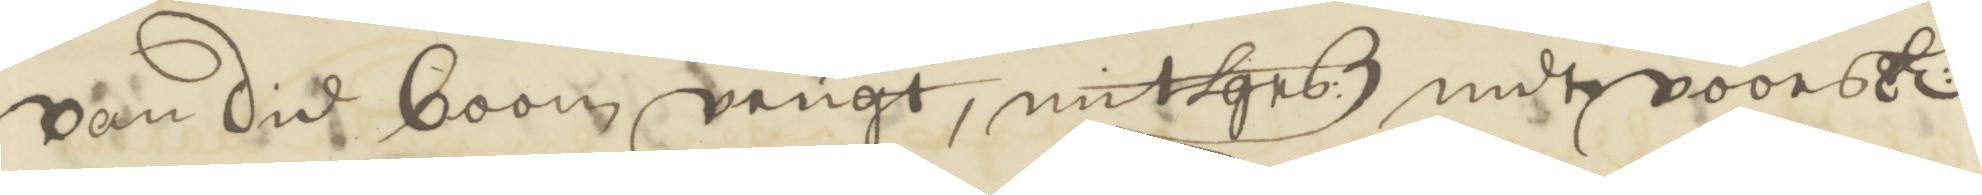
van die boom vrugt, mitsgrs:z met voorsch:
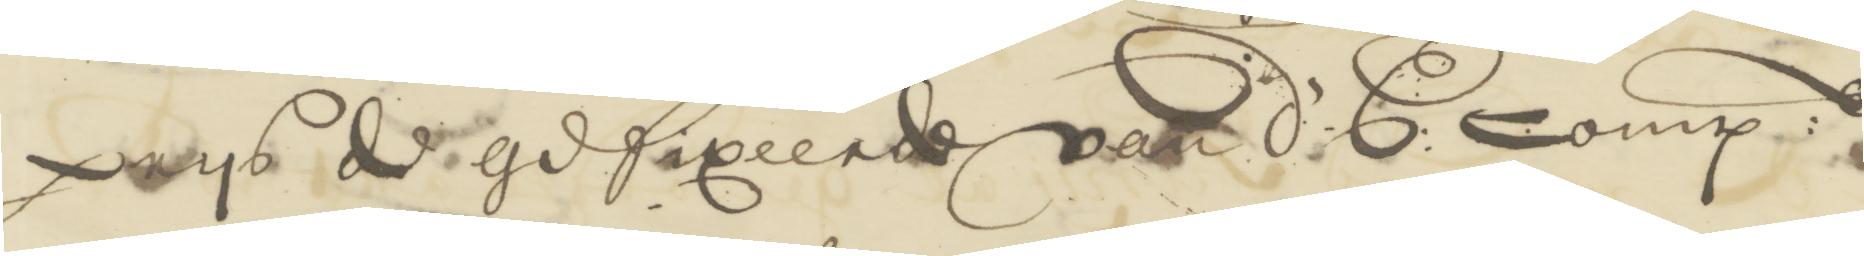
prys de gefixeerde va d' E: comp:s
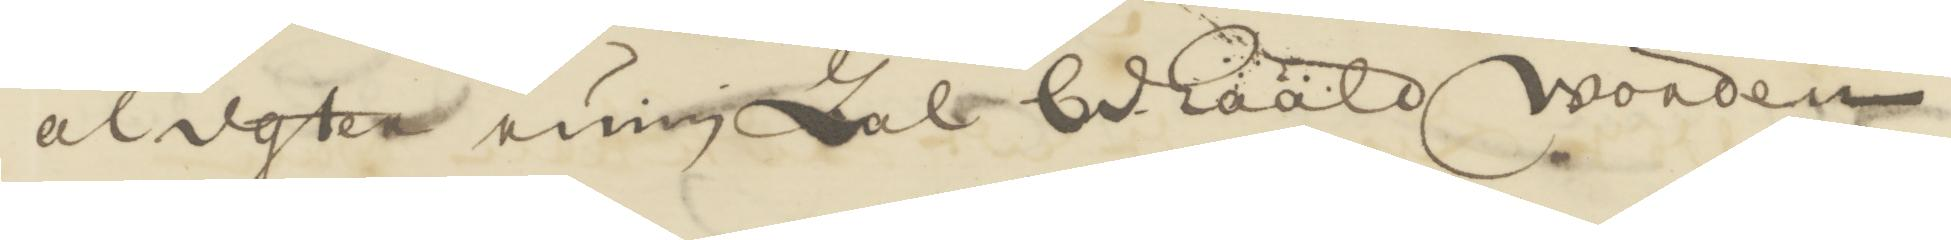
al egter ruim zal behaald worden
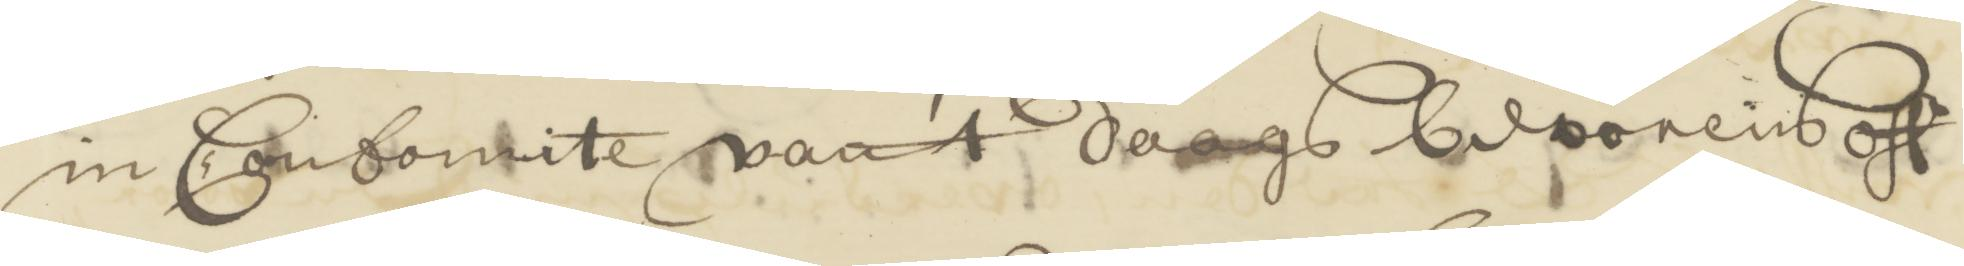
in Confomite van’t daags bevorens off
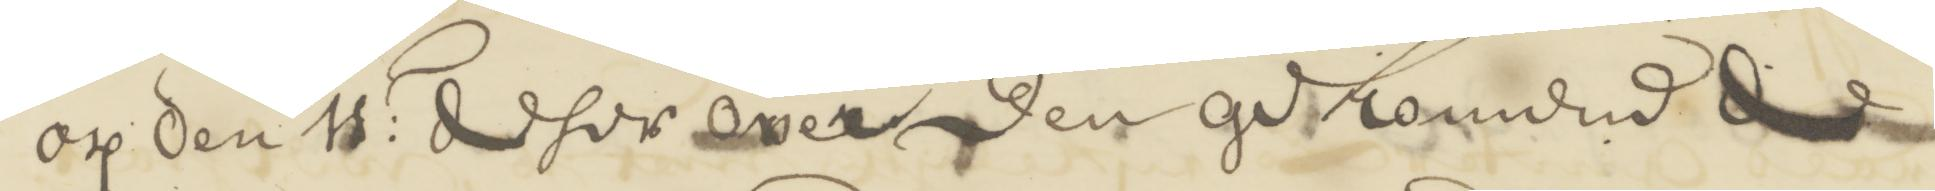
op den 11:' deser over Een gekomene de
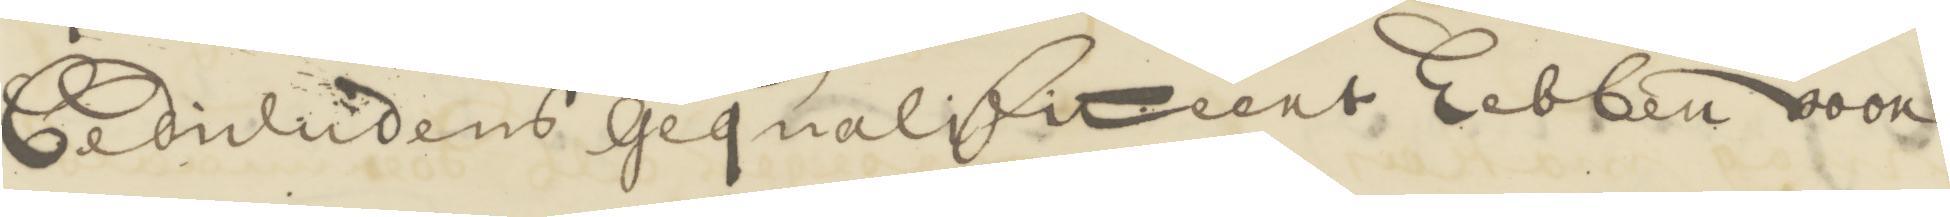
bediendens gequalificeert hebben voor
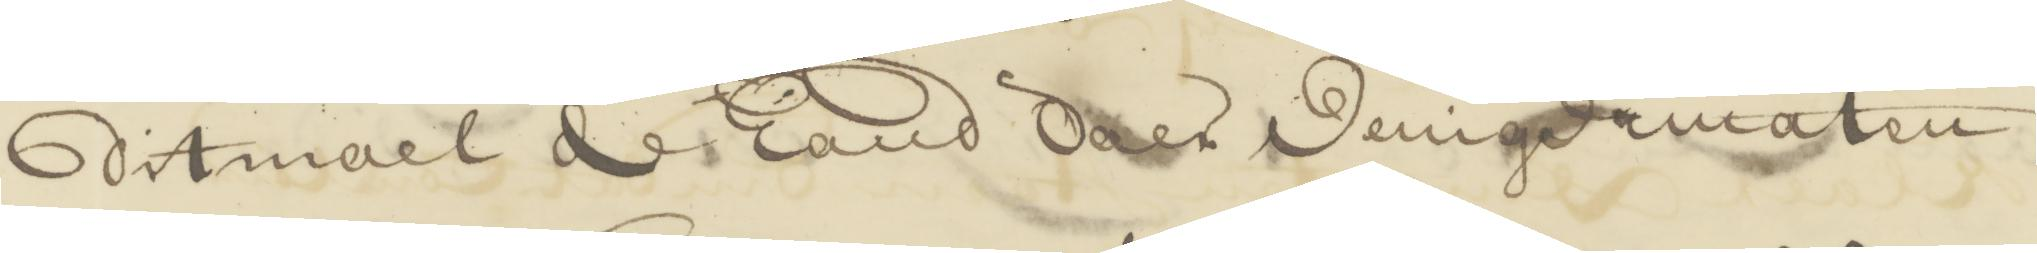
ditmael de hand daer Eenigermaten
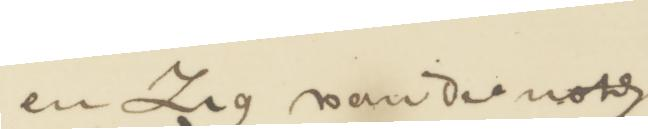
en zig van de noten
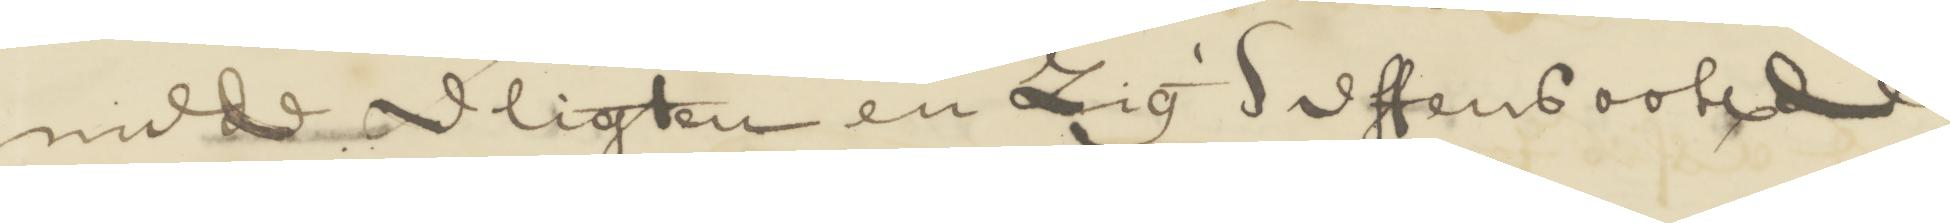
mede te ligten en zig' teffens ook de
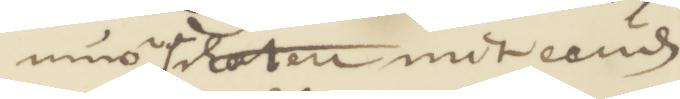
musschaten met eenen
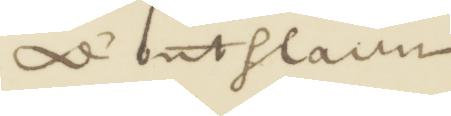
te ontslaen
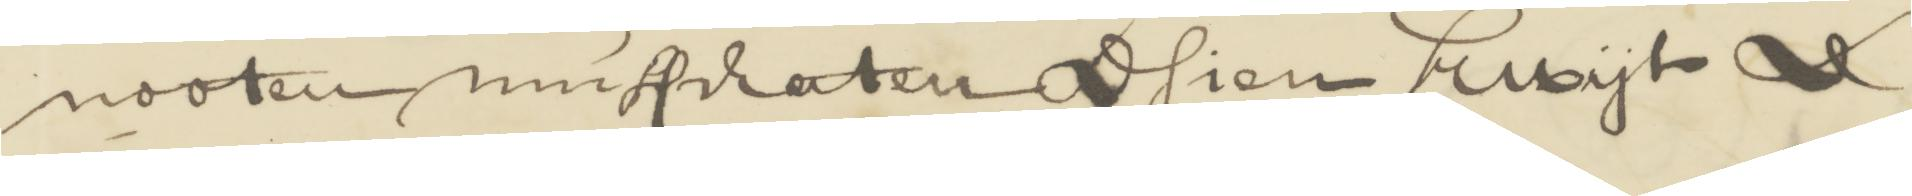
nooten musschaten tesien kwijt te
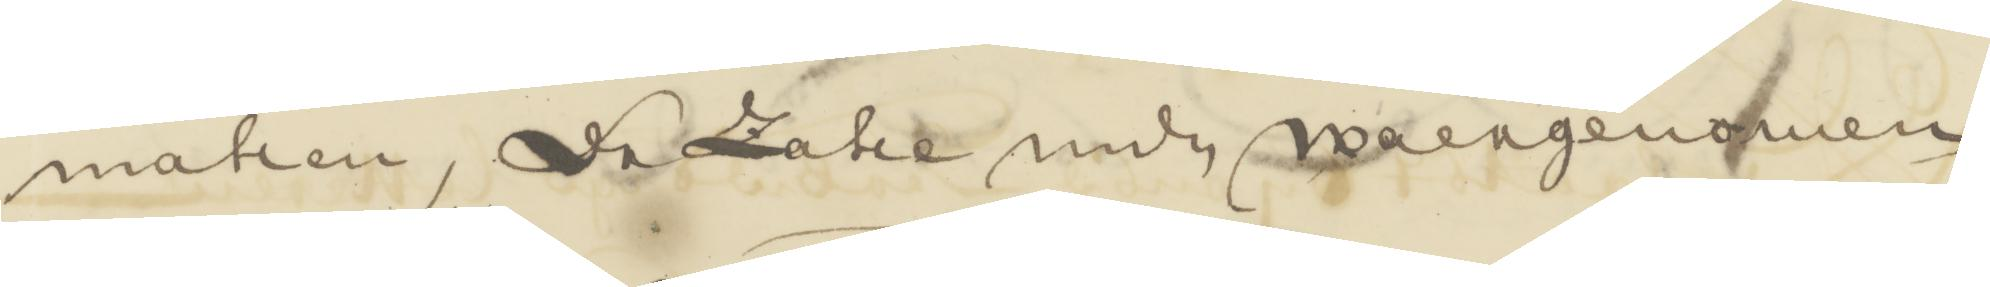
maken, terzake men waergenomen
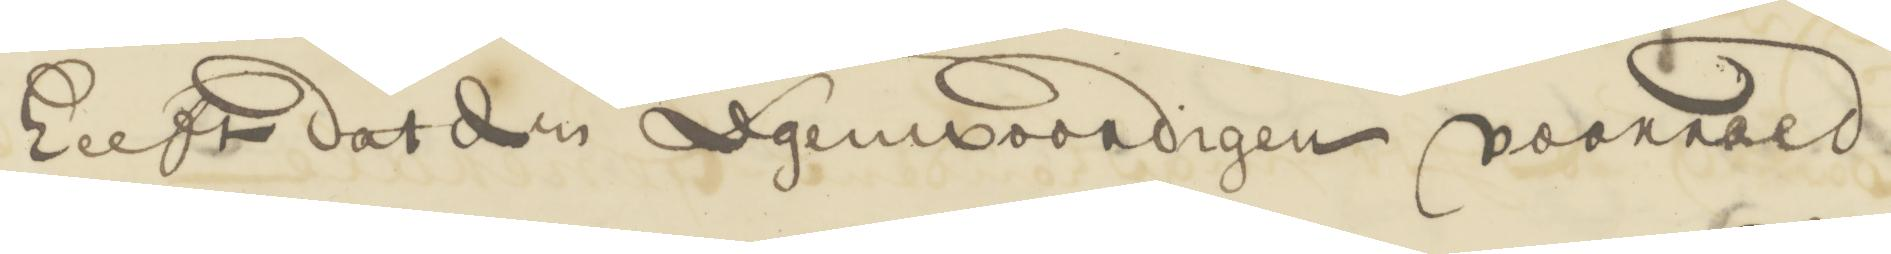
heeft dat den tegenwoordigen voorraed
